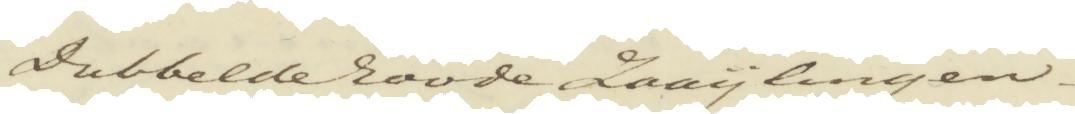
Dubbelde roode Zaaijlingen
